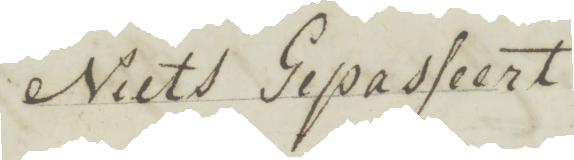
Niets Gepasseert
